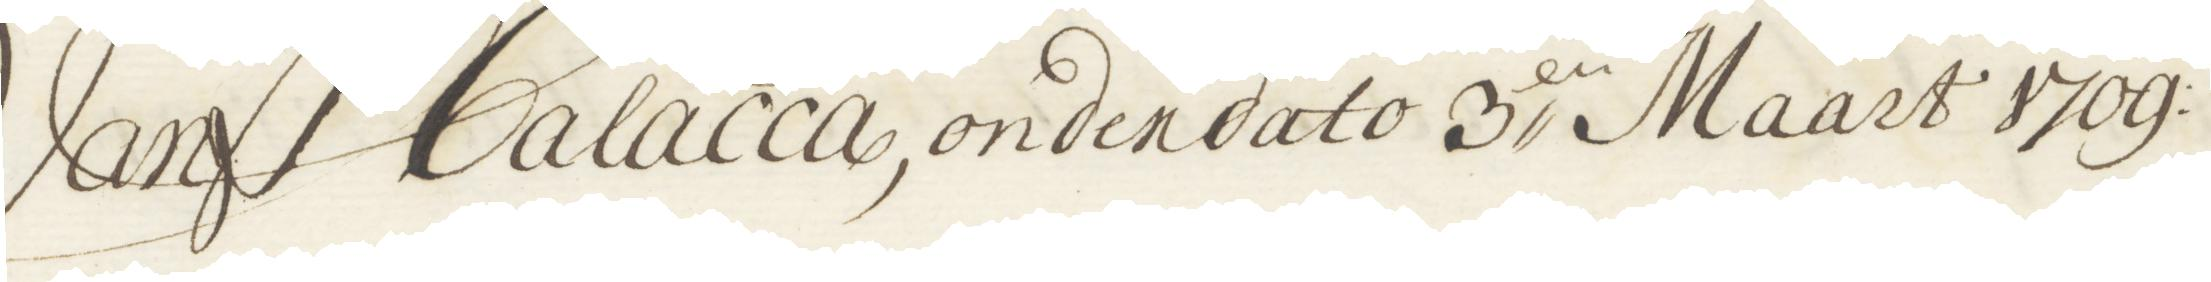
Van Malacca, onderdato 3„en Maart 1709:
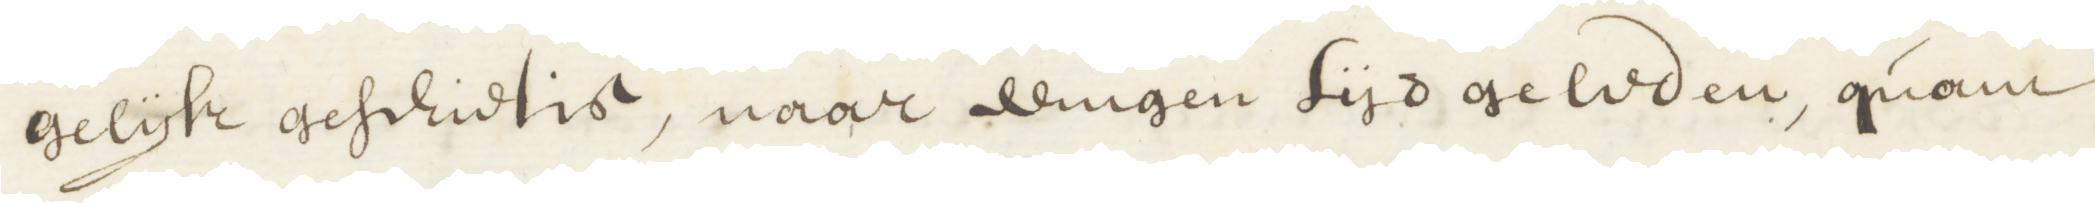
gelijk geschiet is, naar eenigen tijd geleden, quam
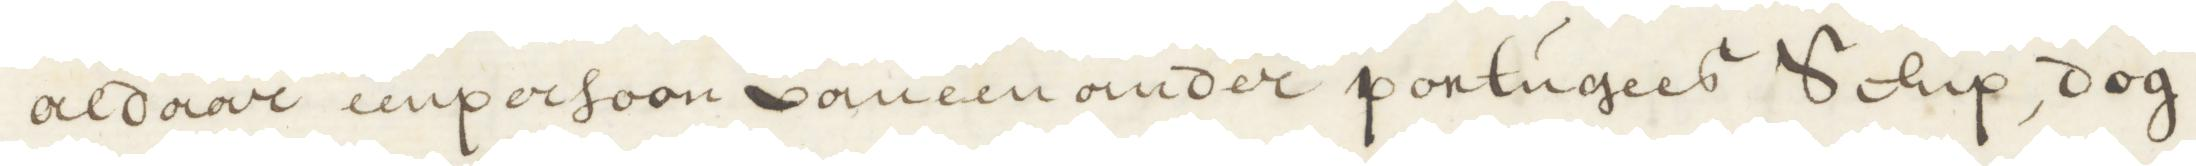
aldaar een persoon van een ander portugees schip, dog
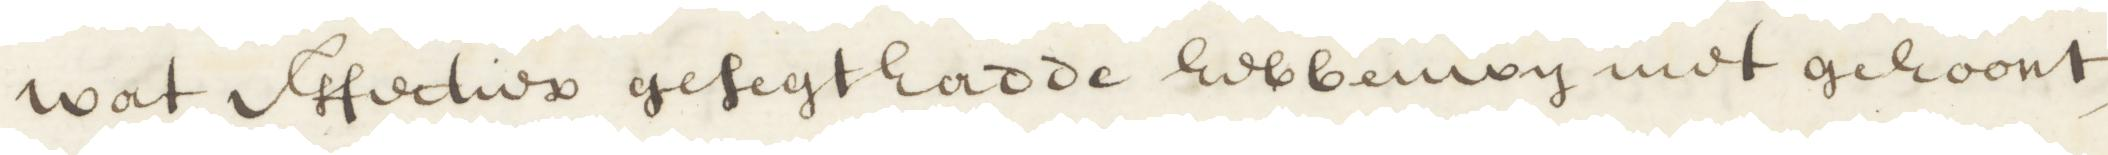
wat Effectiev gesegt hadde hebben wy niet gehoort,
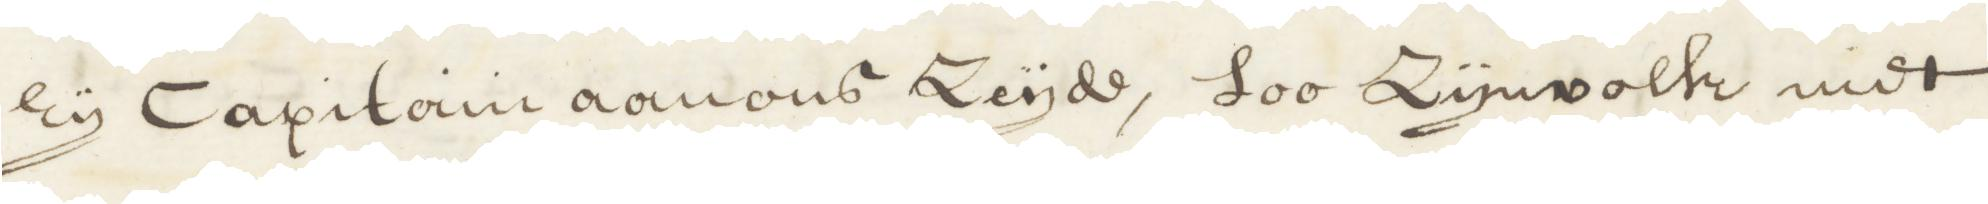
hij Capitain aan ons Zeijde, soo zijn volk niet
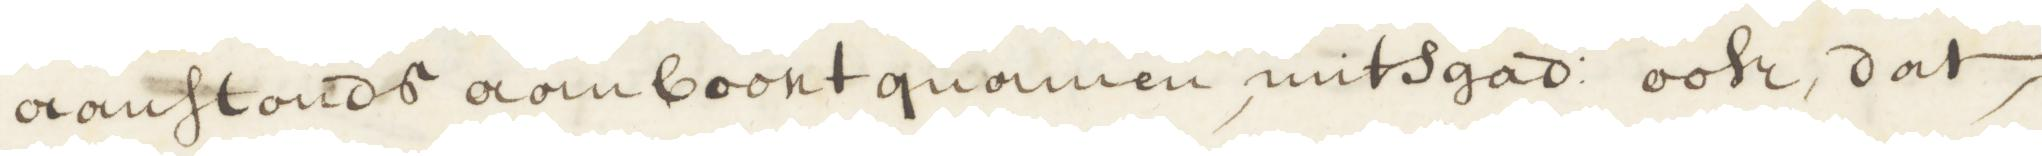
aanstonds aan boort quamen, mitsgad:s ook, dat,
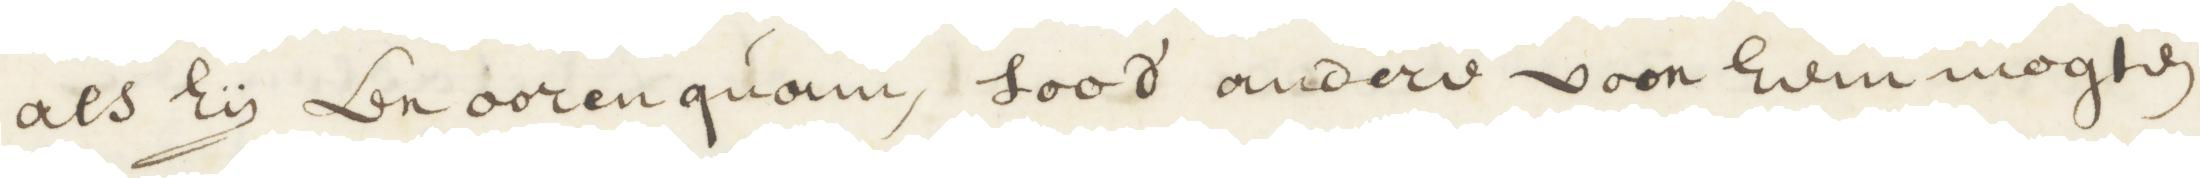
als hij ter ooren quam, soo d' andere voor hem mogten
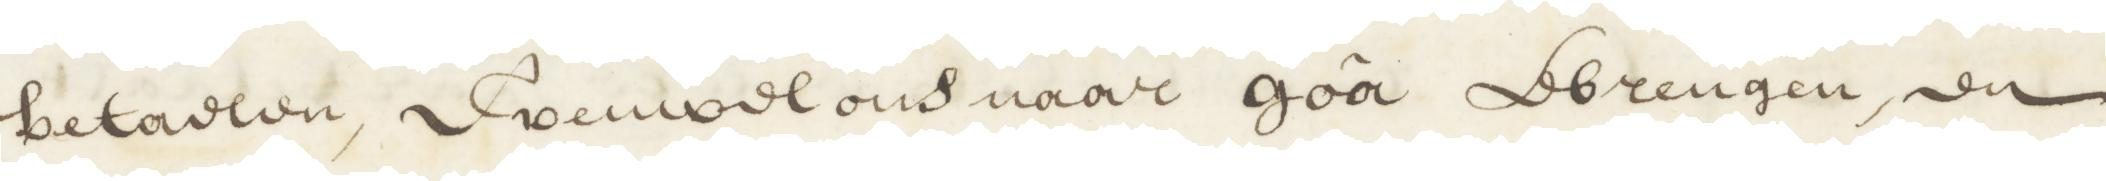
betaelen, Evenwel ons naar goâ te brengen, en
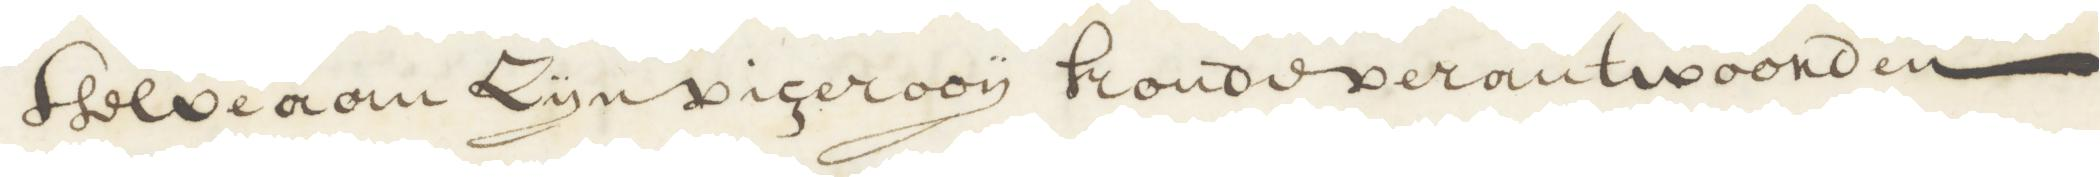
'tselve aan zijn viçerooij konde verantwoorden
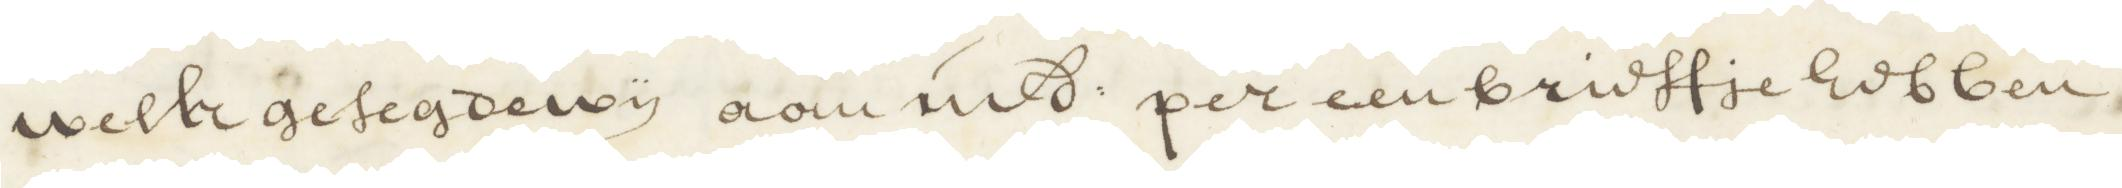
welk gesegde wij aan uEd: per een brieffje hebben
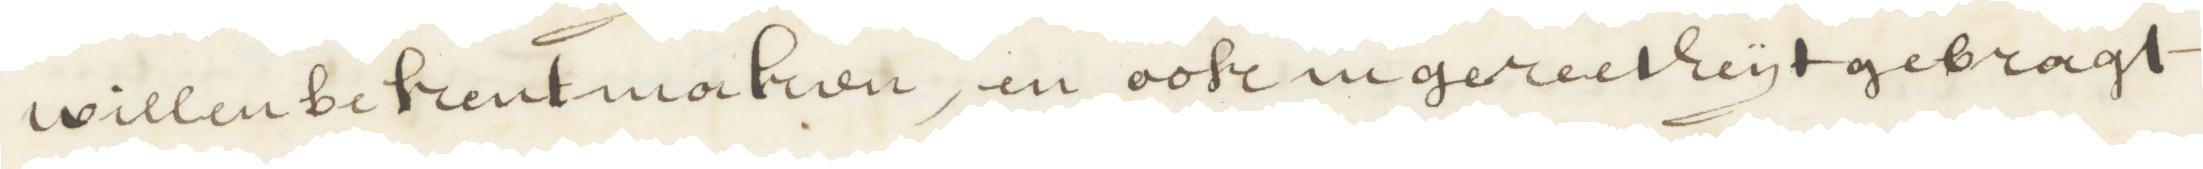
willen bekent maken, en ook in gereetheijt gebragt
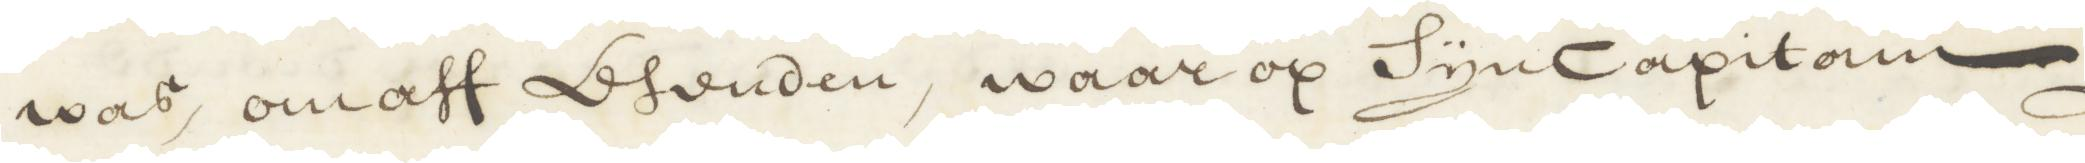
was, om aff tesenden, waar op Sijn capitain
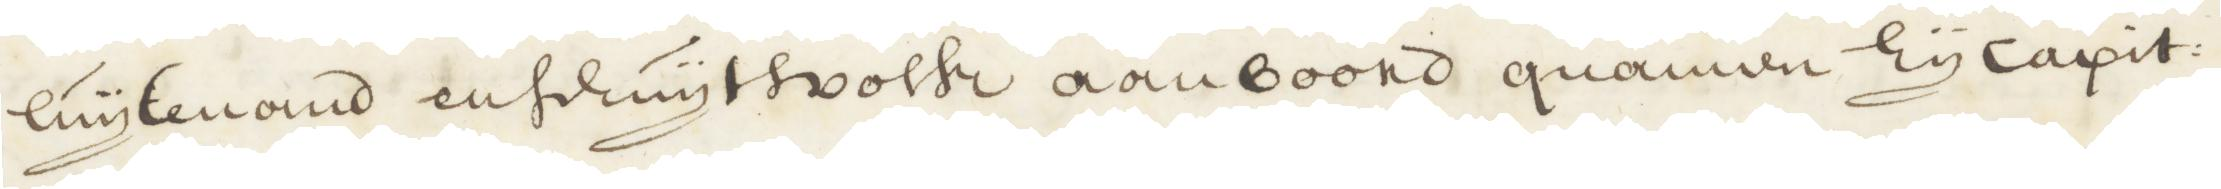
luijtenand en schuijtsvolk aan boord quamen hij capit:
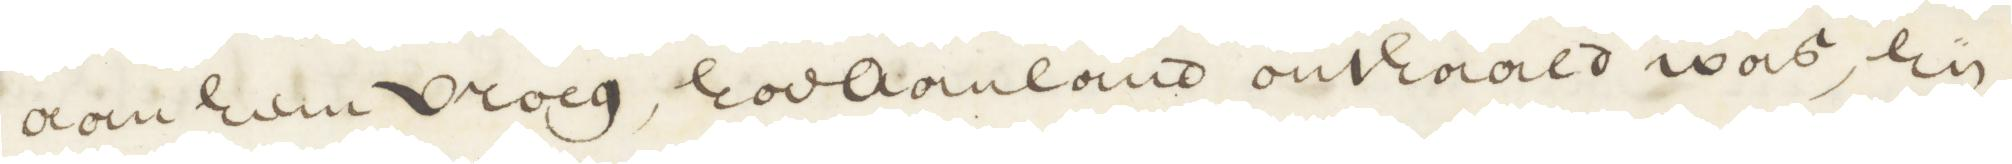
aan hem vroeg, hoe aanland onthaald was, hij
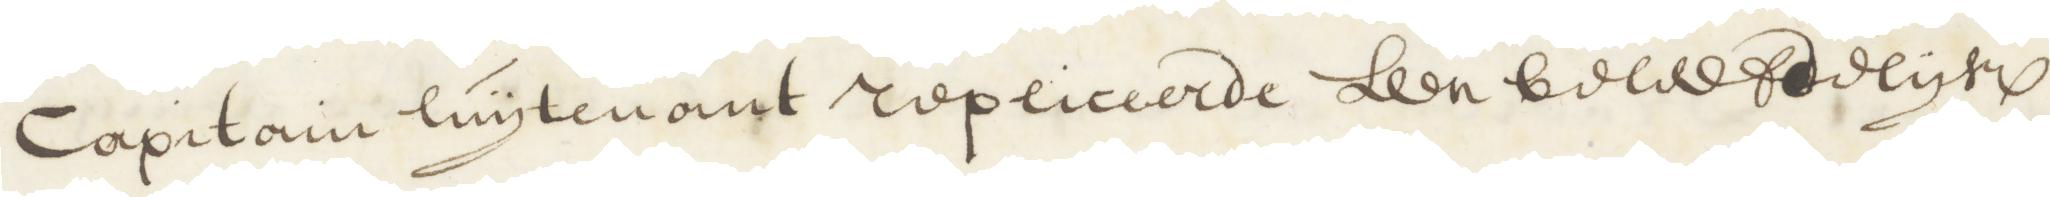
Capitain luijtenant repliceerde seer beleefdelijk
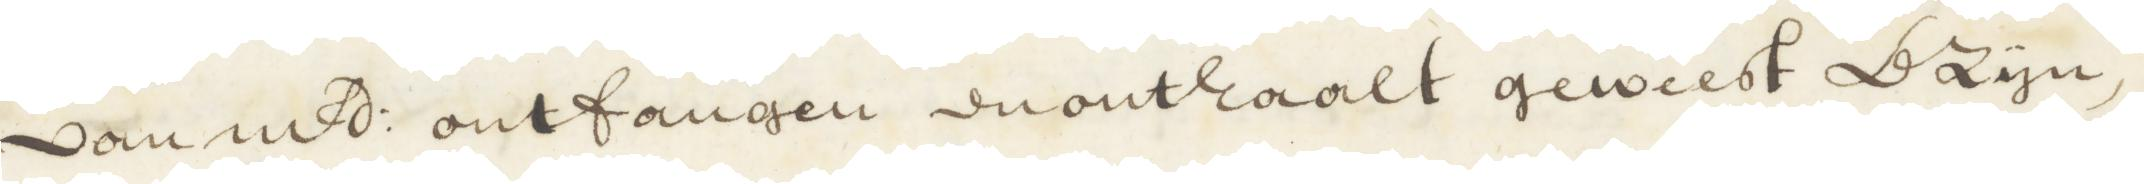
van uEd: ontfangen en onthaalt geweest te zijn,
